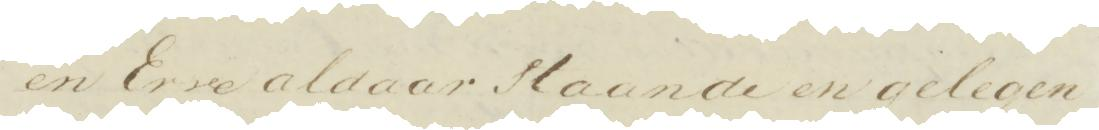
en Erve aldaar staande en gelegen
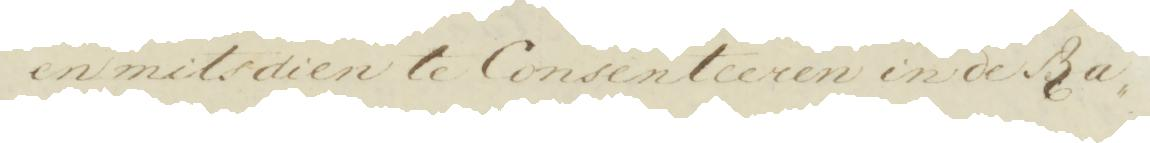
en mitsdien te Consenteeren in de Ra„
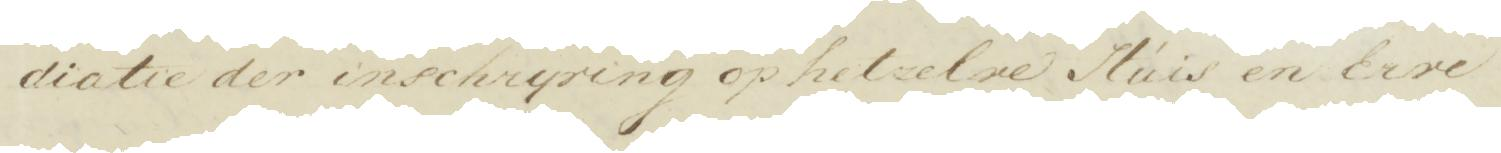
diatie der inschryving op hetzelve Huis en Erve
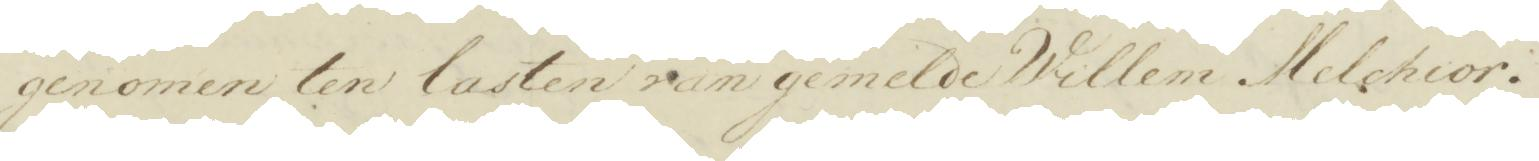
genomen ten lasten van gemelde Willem Melchior.
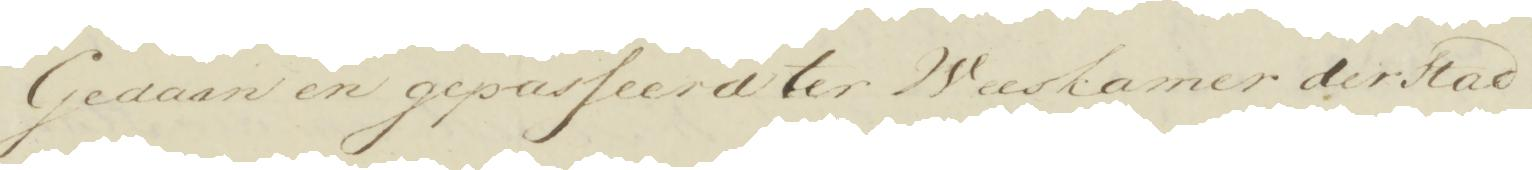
Gedaan en gepasseerd ter Weeskamer der stad
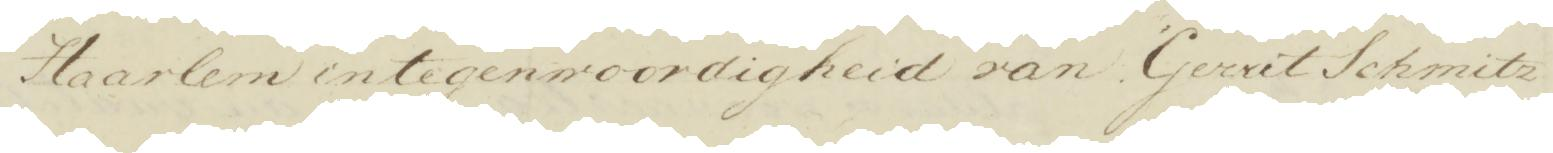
Haarlem, in tegenwoordigheid van Gerrit Schmitz
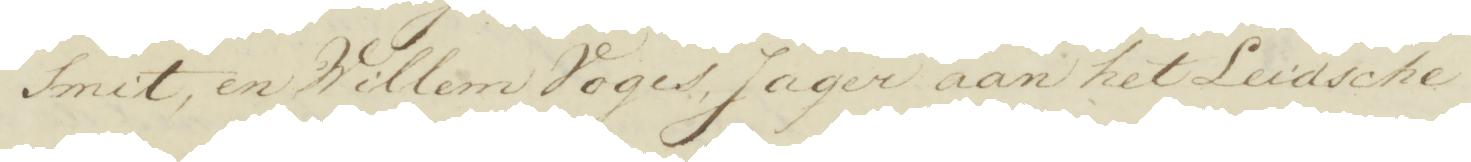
smit, en Willem Voges, Jager aan het Leidsche
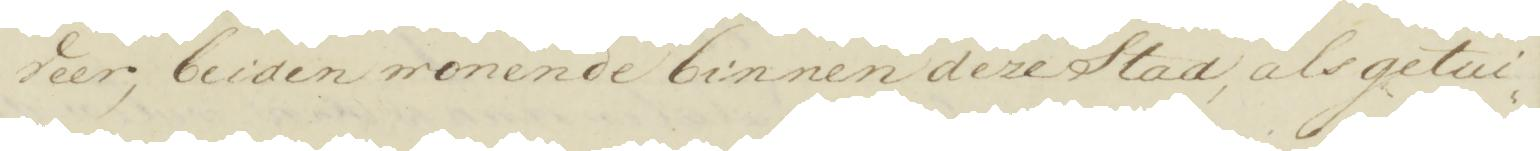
veer, beiden wonende binnen deze stad, als getui„
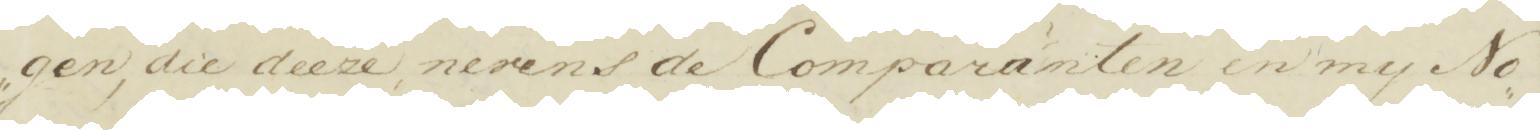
gen, die deeze, nevens de Comparanten en mij No„
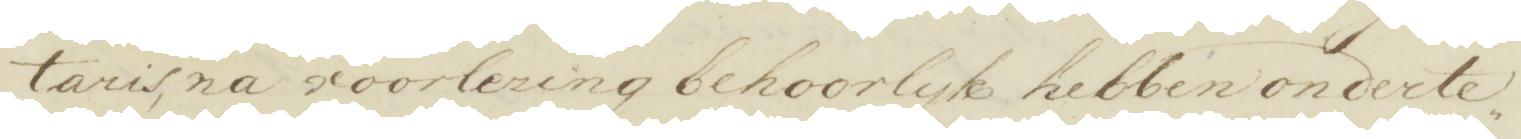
taris, na voorlezing behoorlijk hebben onderte„
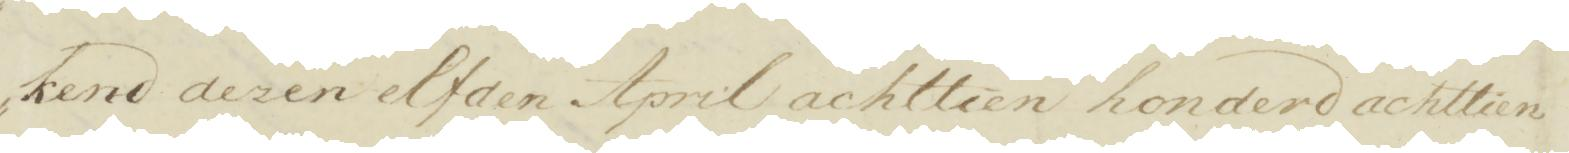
kend dezen elfden April achttien honderd achttien
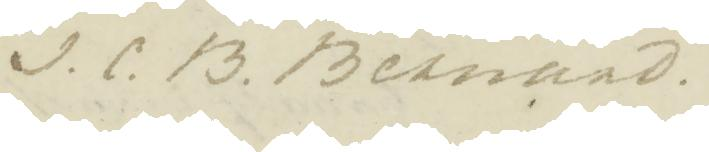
I. C. B. Bernard.
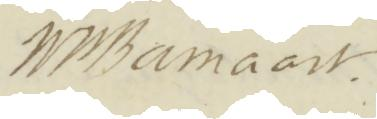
WPBarnaart.
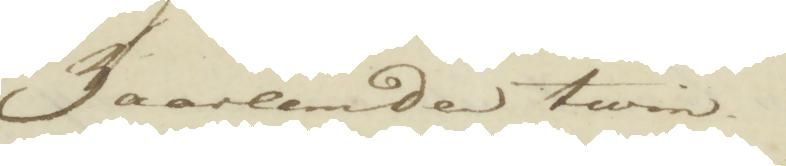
Haarlem den twin.
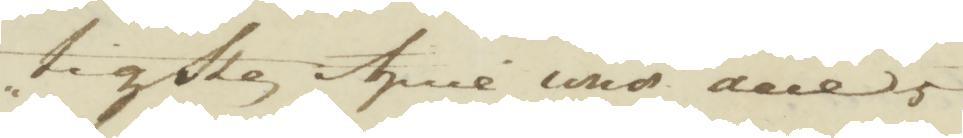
„tigsten April 1818 deel 5
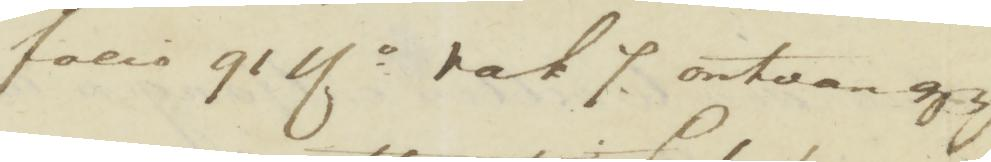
folio 91 V:o vak 7. ontvangen
